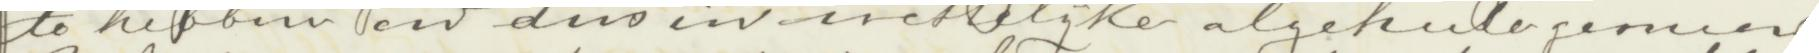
te hebben en dus in wettelijke algeheele gemeen
